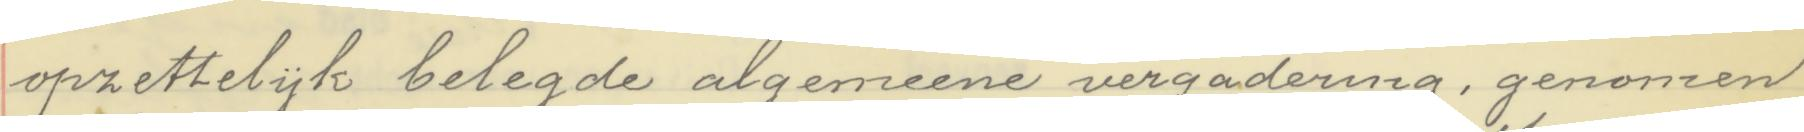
opzettelijk belegde algemeene vergadering, genomen
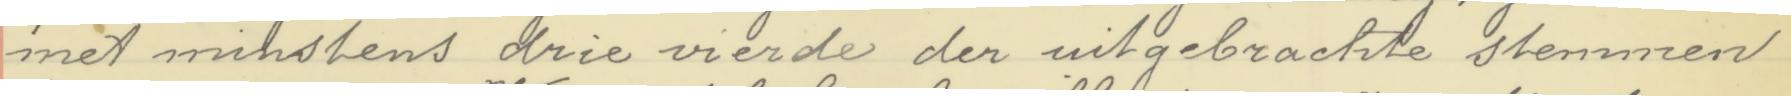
met minstens drie vierde der uitgebrachte stemmen
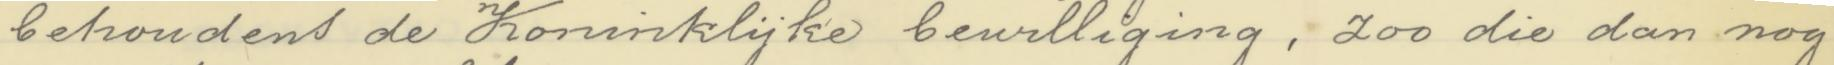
behoudens de Koninklijke bewilliging, zoo die dan nog
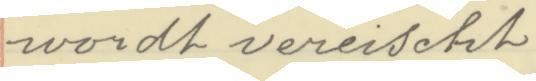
wordt vereischt
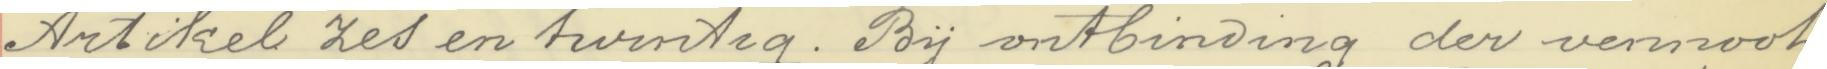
Artikel zes en twintig. Bij ontbinding der vennoot
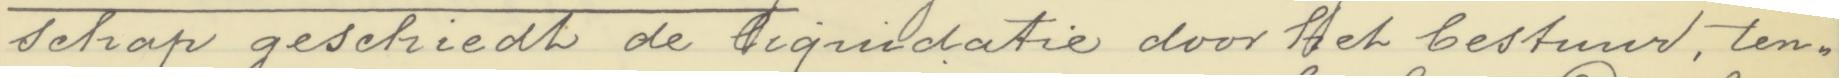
schap geschiedt de liquidatie door het bestuur, ten„
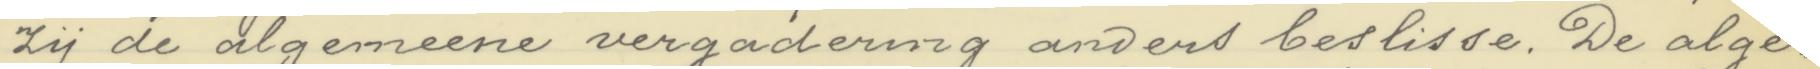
zij de algemeene vergadering anders beslisse. De alge„
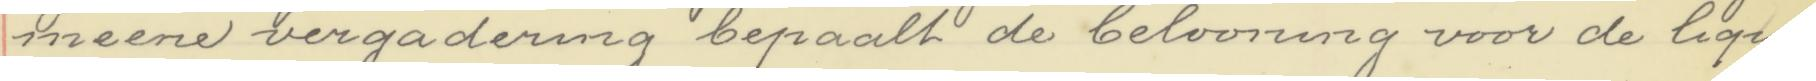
meene vergadering bepaalt de belooning voor de liqui
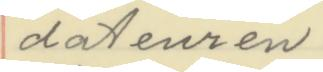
dateuren
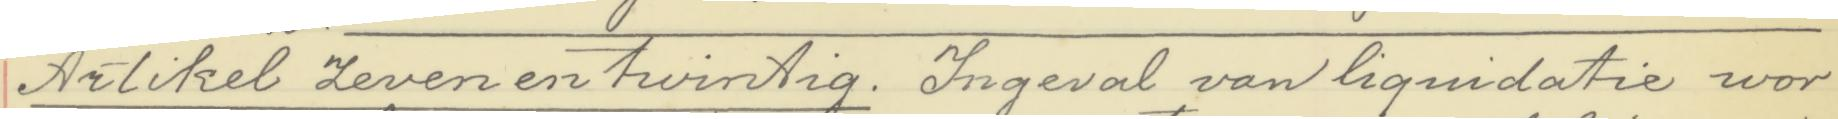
Artikel zeven en twintig. Ingeval van liquidatie wor
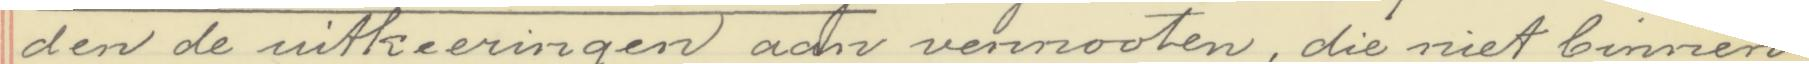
den de uitkeeringen aan vennooten, die niet binnen
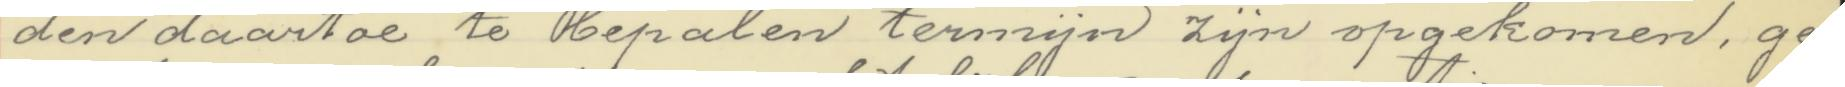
den daartoe te bepalen termijn zijn opgekomen, ge
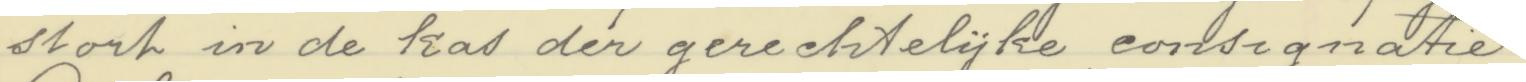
stort in de kas der gerechtelijke consignatie
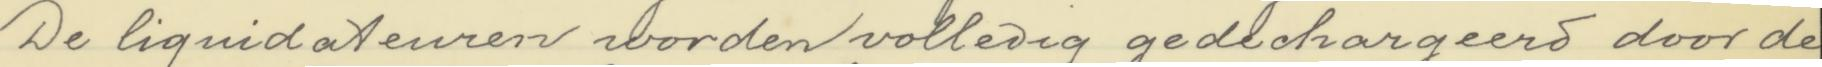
De liquidateuren worden volledig gedechargeerd door de
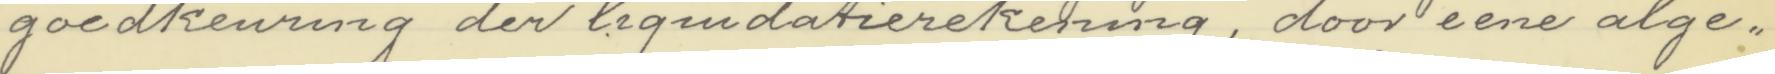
goedkeuring der liquidatierekening, door eene alge„
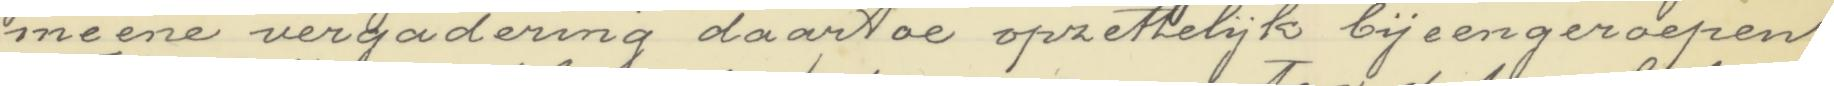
meene vergadering daartoe opzettelijk bij een geroepen.
